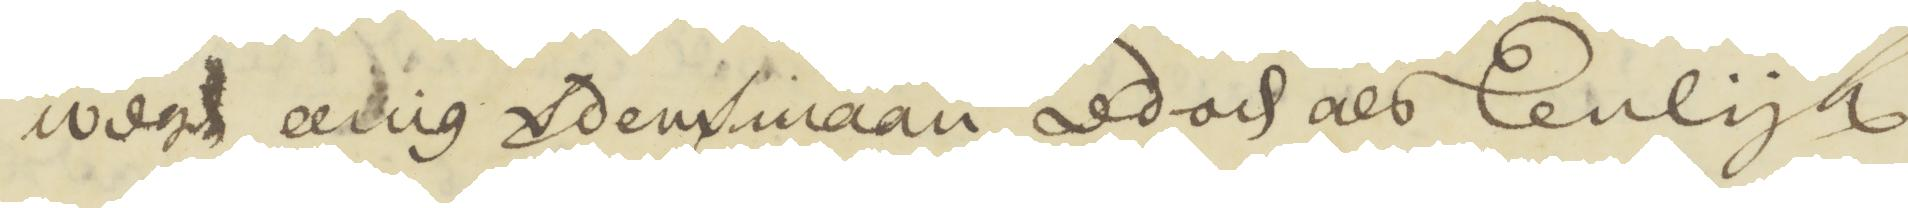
wegen eenig verder vermaan Edoch als Eerlijk
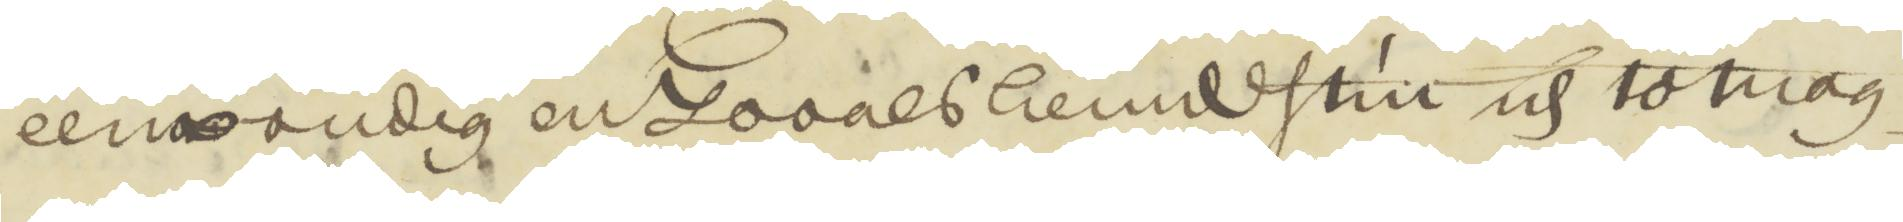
eenvoudig en Zoo als hem de stucken tot nog
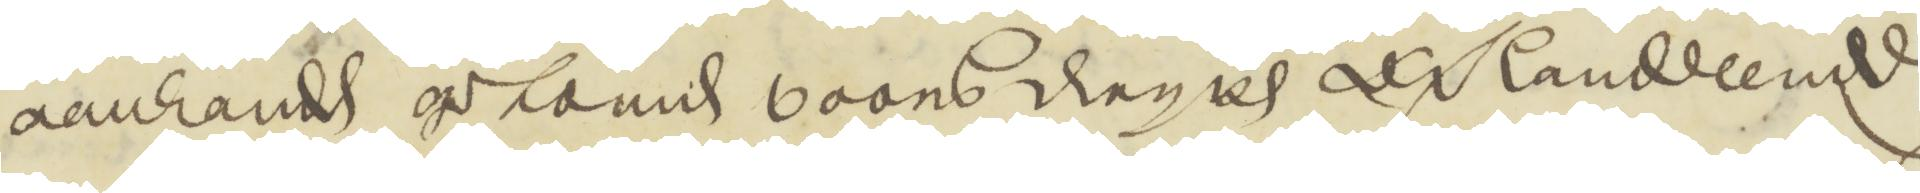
aanhanden gekomen voorschryven te verhandelende
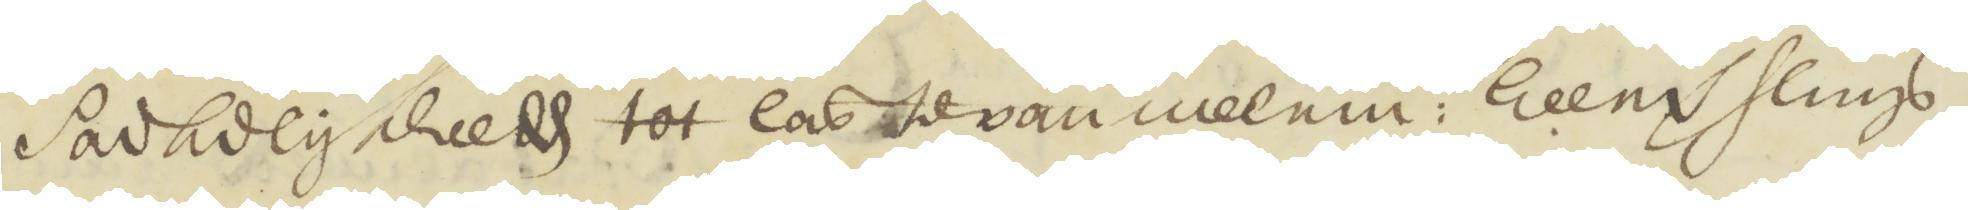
Saekelijkheeden tot laste van meerm: heer versluys
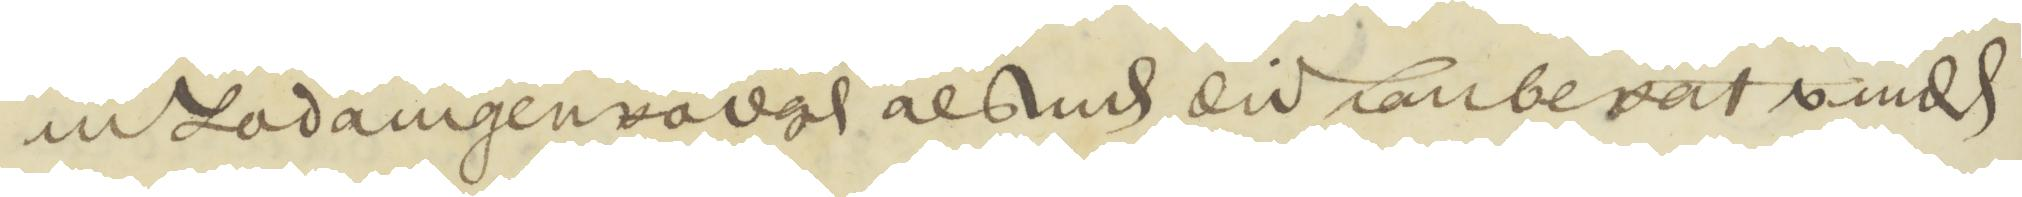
in Zodanigen voegen als men die kan bevat vinden
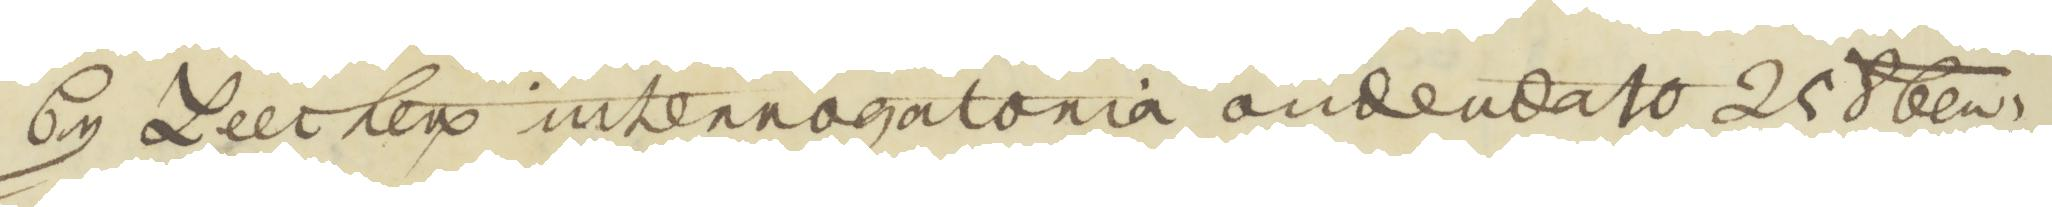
by Zeecker interrogatoria onder dato 25 8ber:
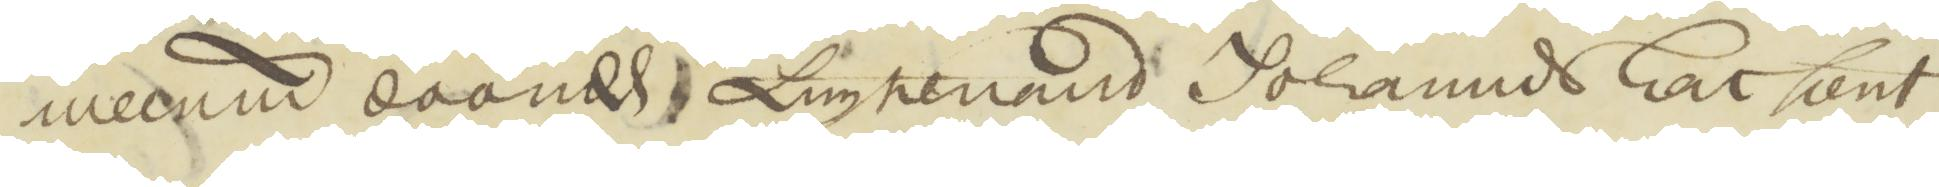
meerm door den Luytenand Iohannes hackert
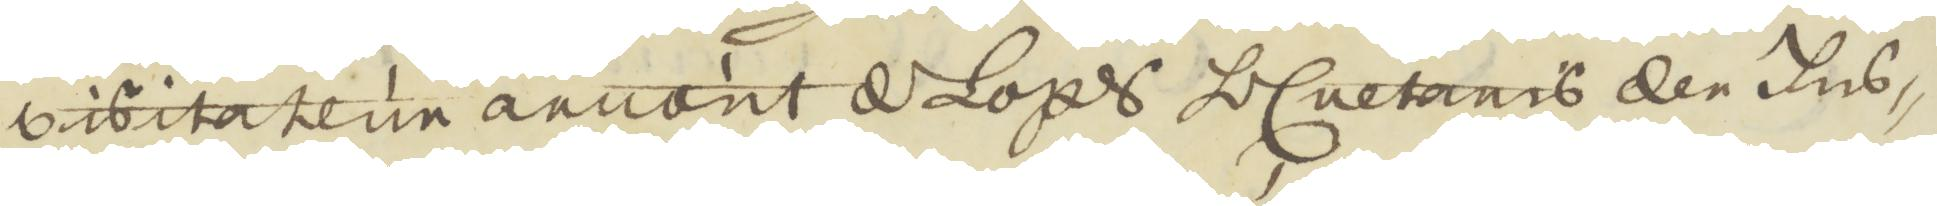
visitateur arnout de Lopes secretaris der Ius„
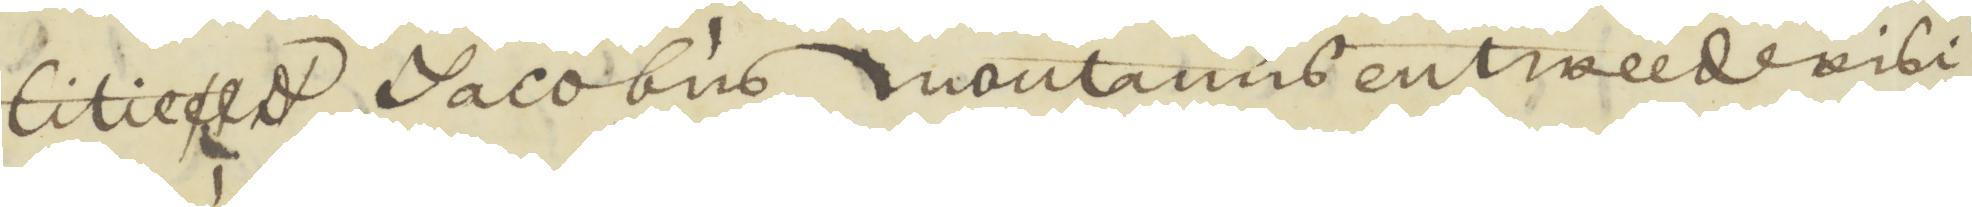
titie eld Iacobus montanus en tweede visi
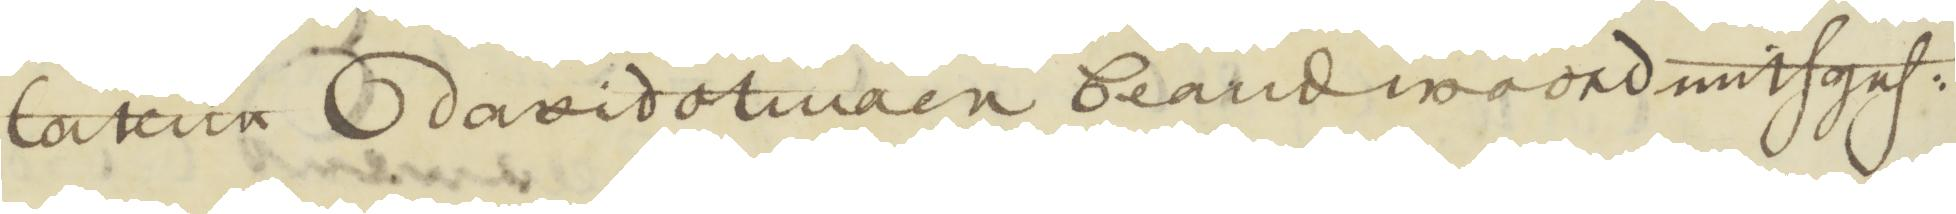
tateur david otmaer beandwoord mitsgrs:
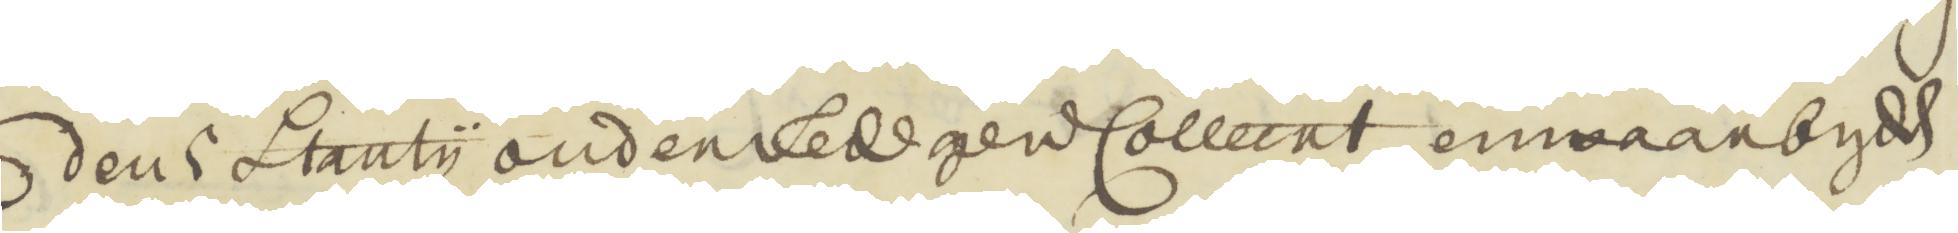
den 5 Stantij onder Eede gerecolleert en waar byden
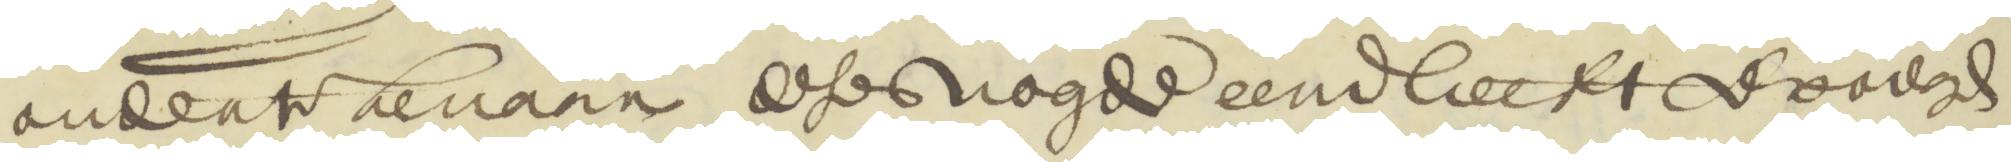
onder tekenaar deses nog de eere heeft tevoegen
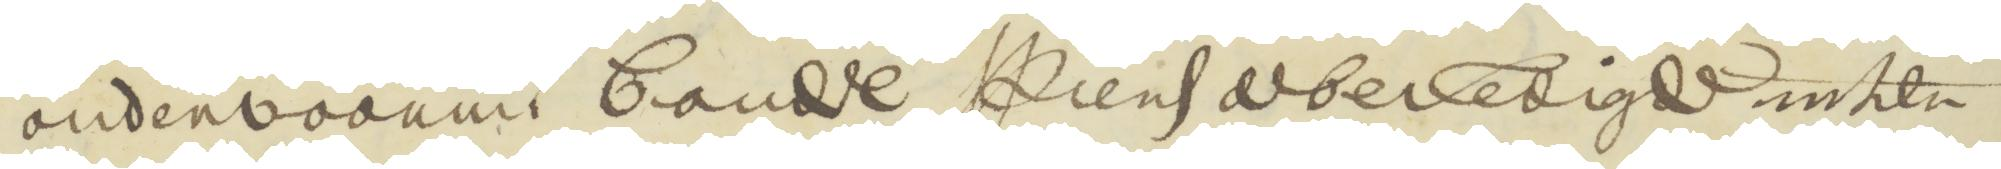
ondervoorm: bondel papieren de beeedigde inter
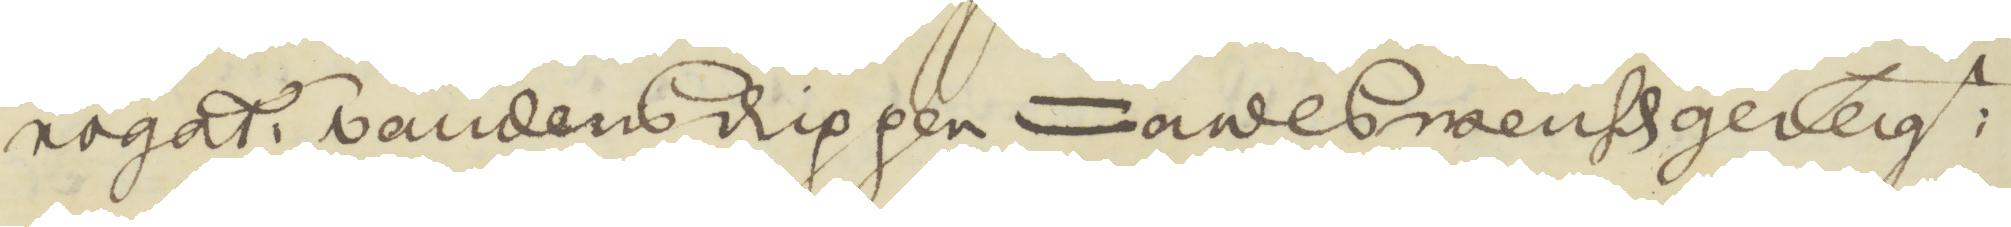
rogat: van den Schipper cawes wensen geelig:t
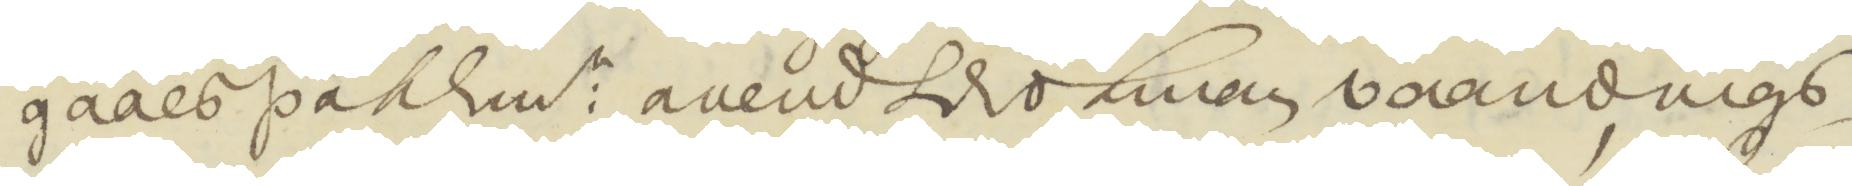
gaals pakhm:r arend schokman vaandrigs
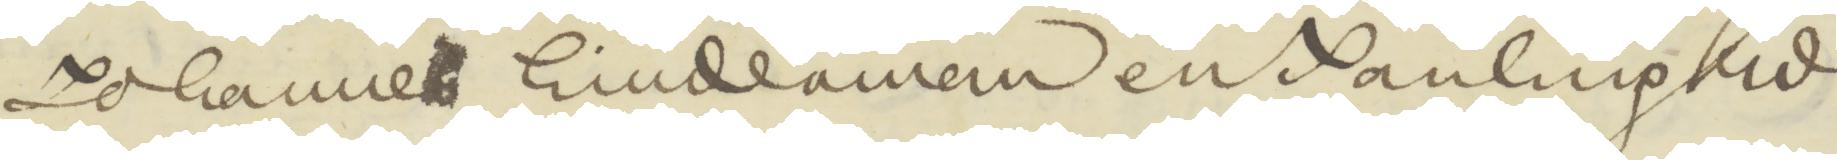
Iohannes hinderman en Jan hupkie
